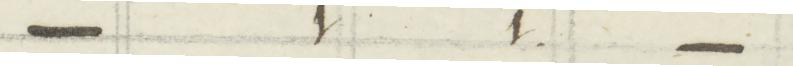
— 1 1. —
